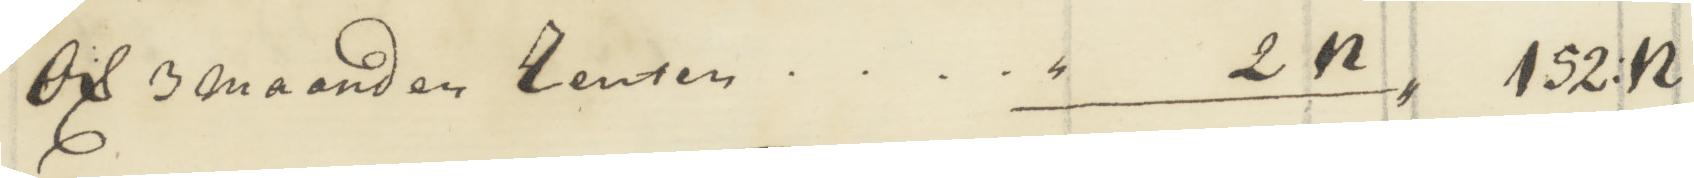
Over 3 maanden renten . . . . „ 2 12 „ 152:12
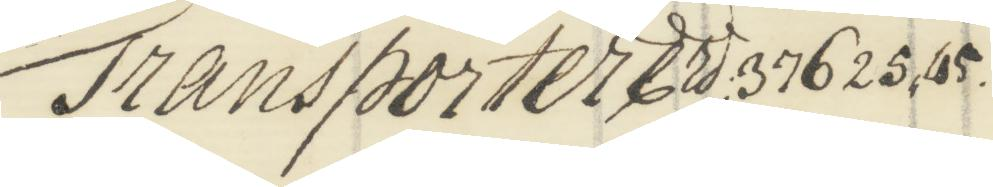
Transportererd: 37625„45
